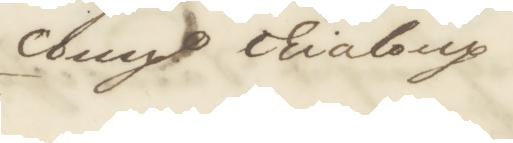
Comp:s Chialoup
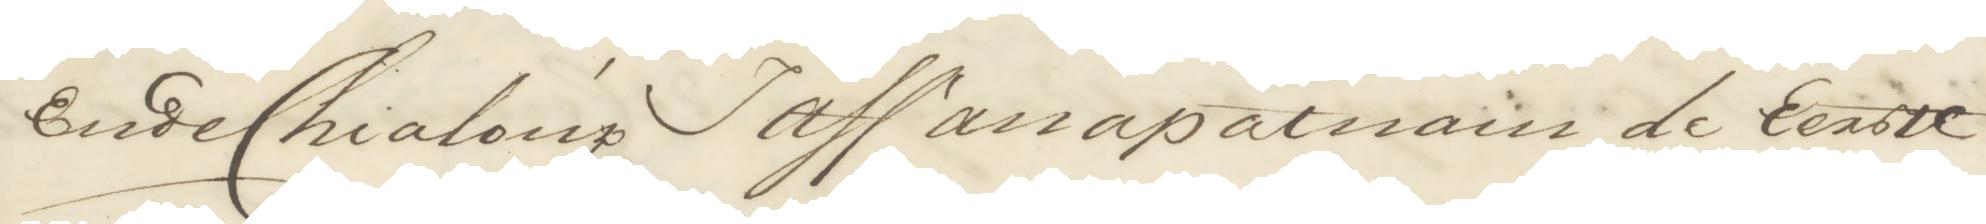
ende Chialoup Jaffanapatnam de Eerste
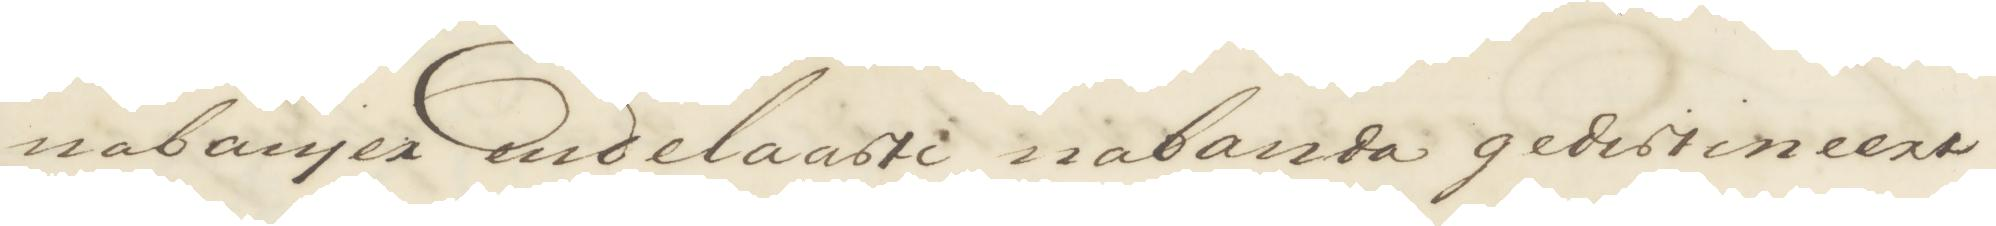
na banjer ende laaste na banda gedistineert
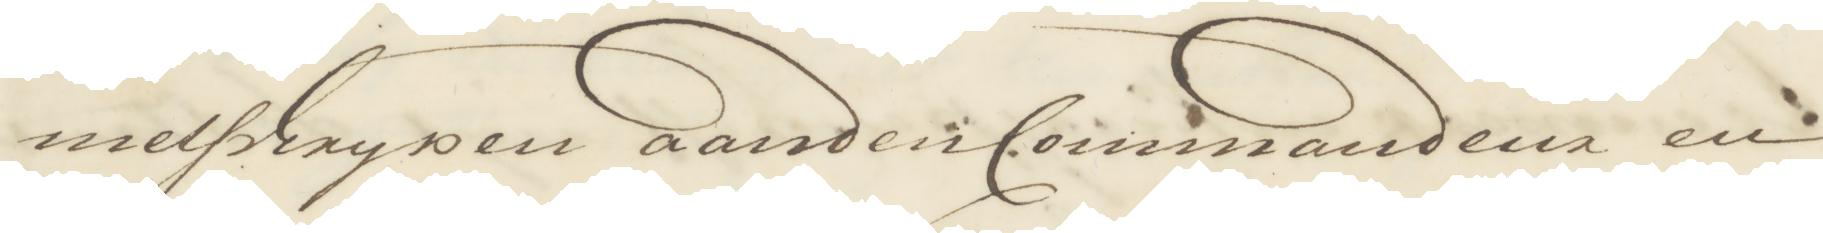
met schryven aan den Commandeur en
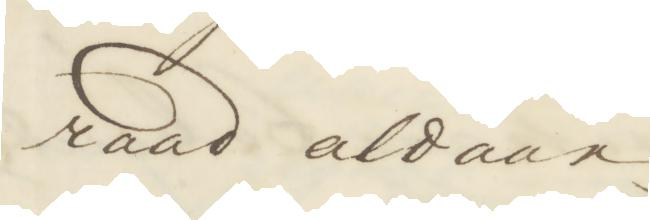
raad aldaar
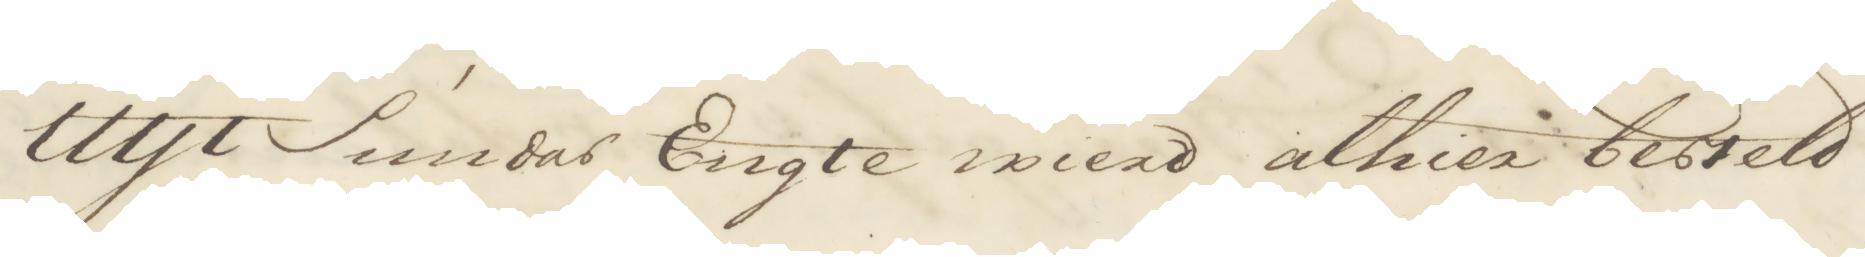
Uyt Sundas Engte wierd alhier besteld
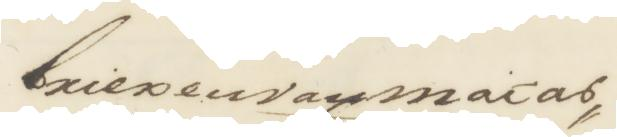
brieven van macas„
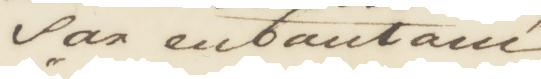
s„ar en bantam
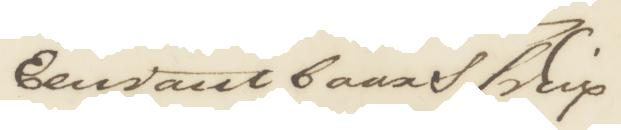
Een van't baars schip
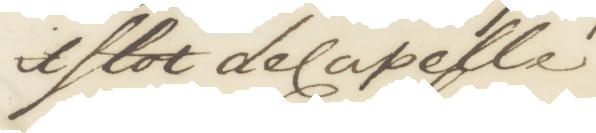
’t Slot de Capelle
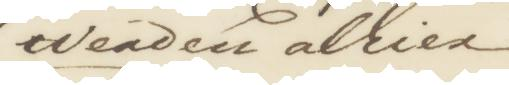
werden alhier
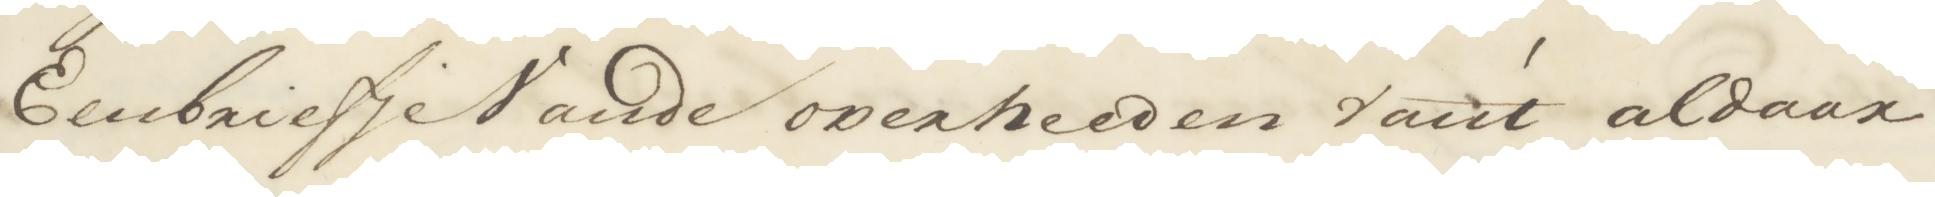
Een briefje vande overheeden van 't aldaar
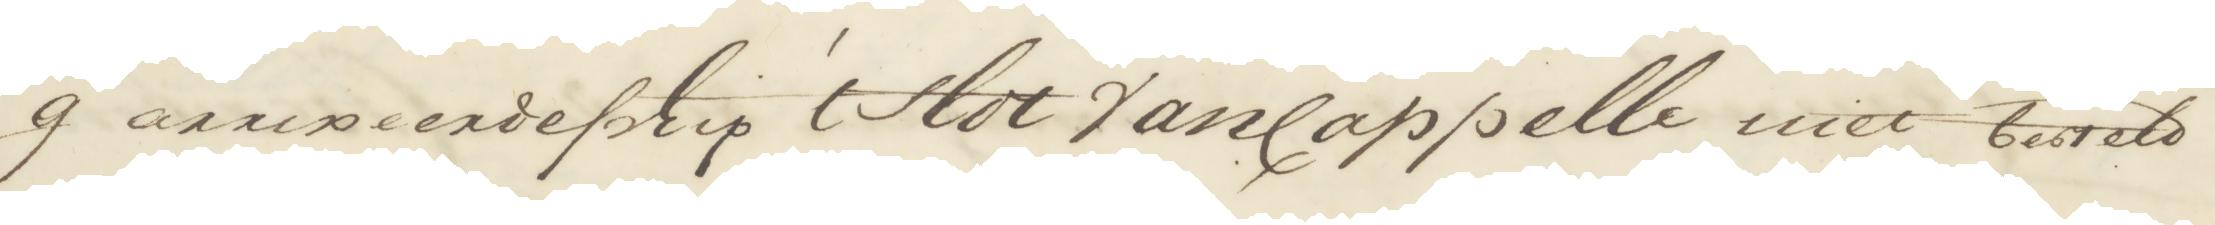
g’ arriveerde schip 't slot van Cappelle niet besteld
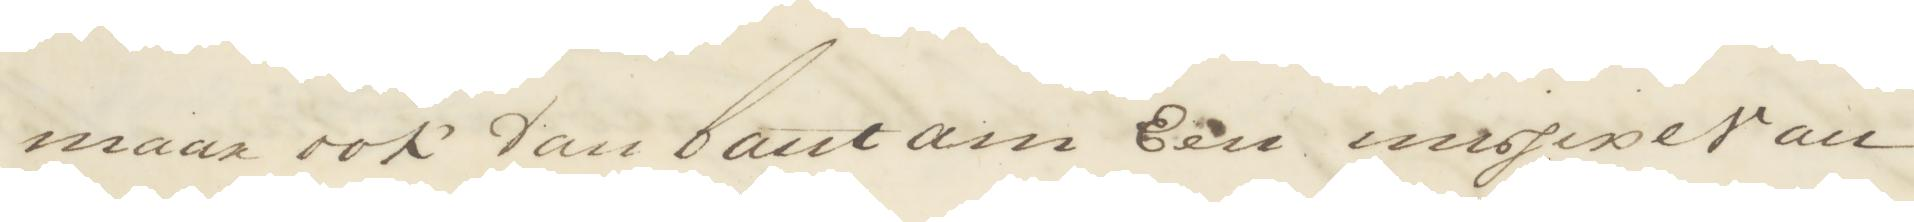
maar ook van bantam Een missive van
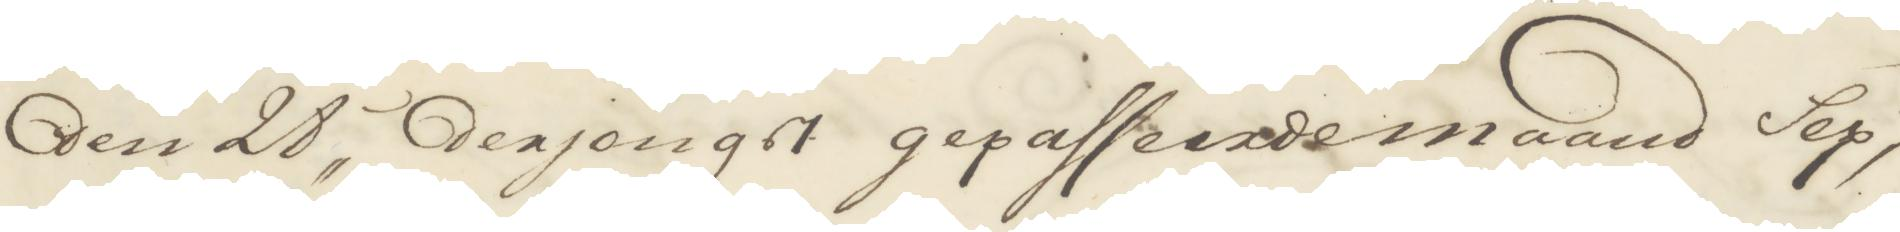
den 28„ der jongst gepasseerde maand Sep,
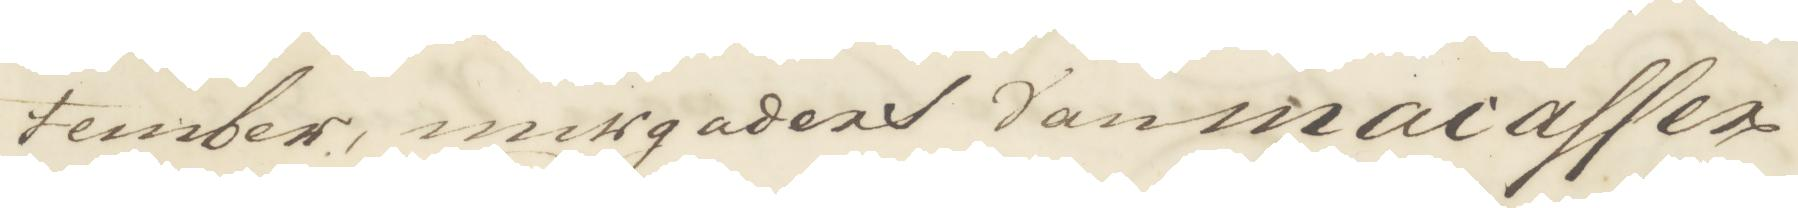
tember, mitsgaders van macasser
